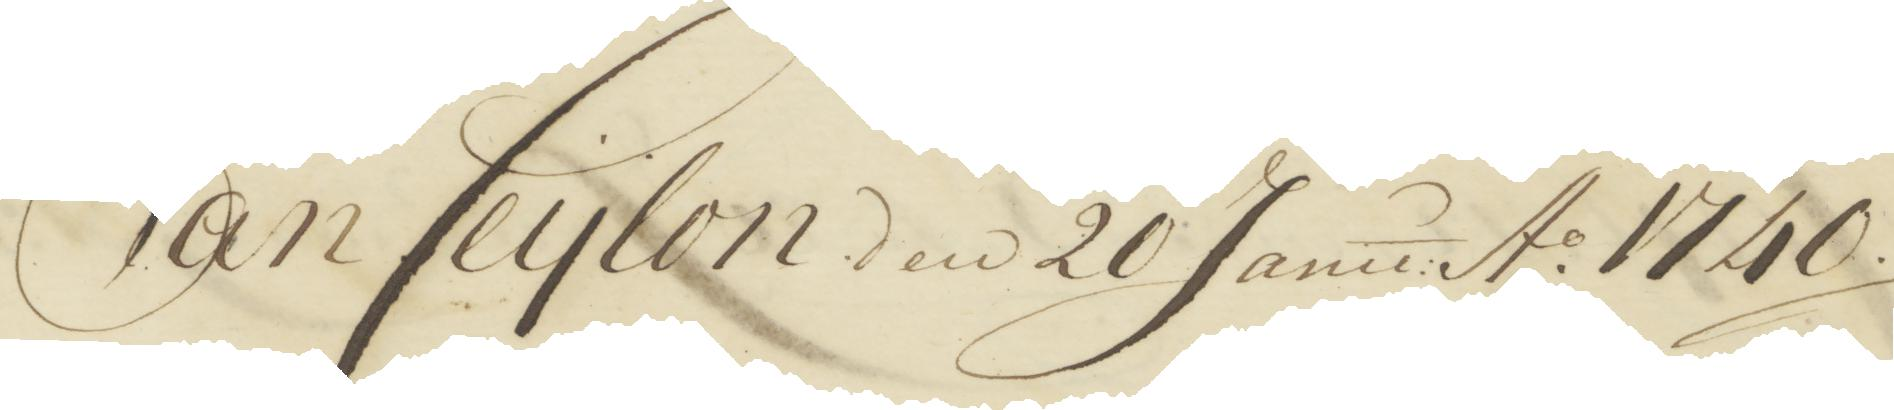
Van Ceijlon den 20 Janu: A.o 1740:
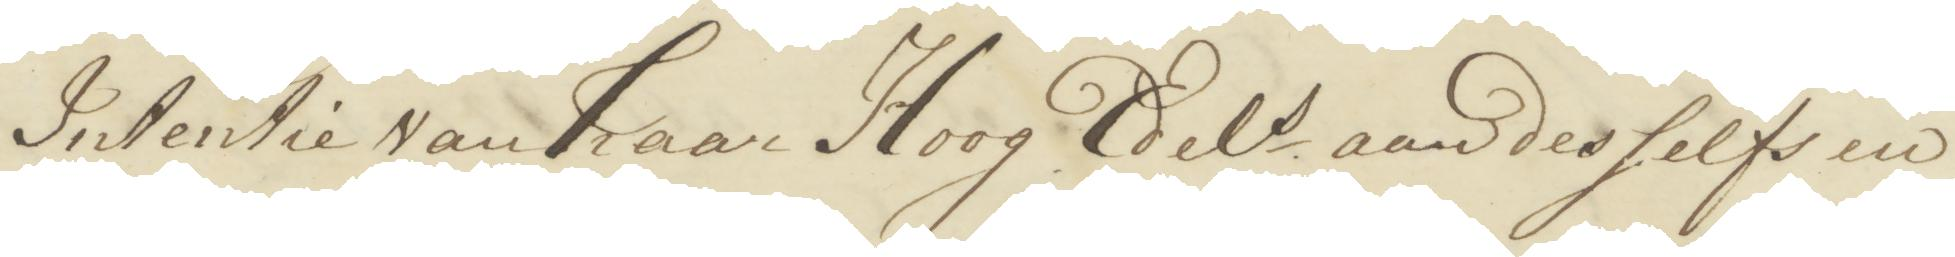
Intentie van haar Hoog Edel-s aan desselfs en
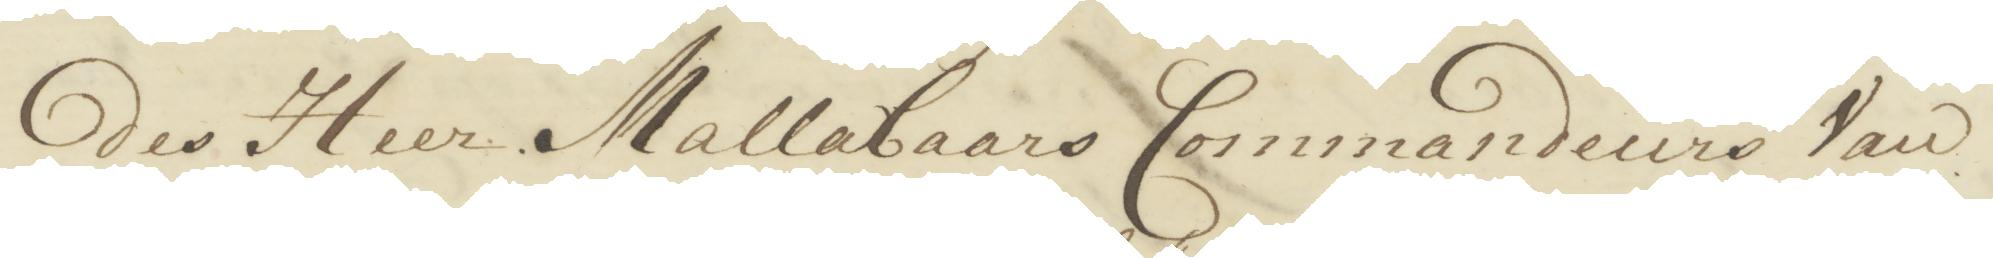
des Heer Mallabaars Commandeurs van
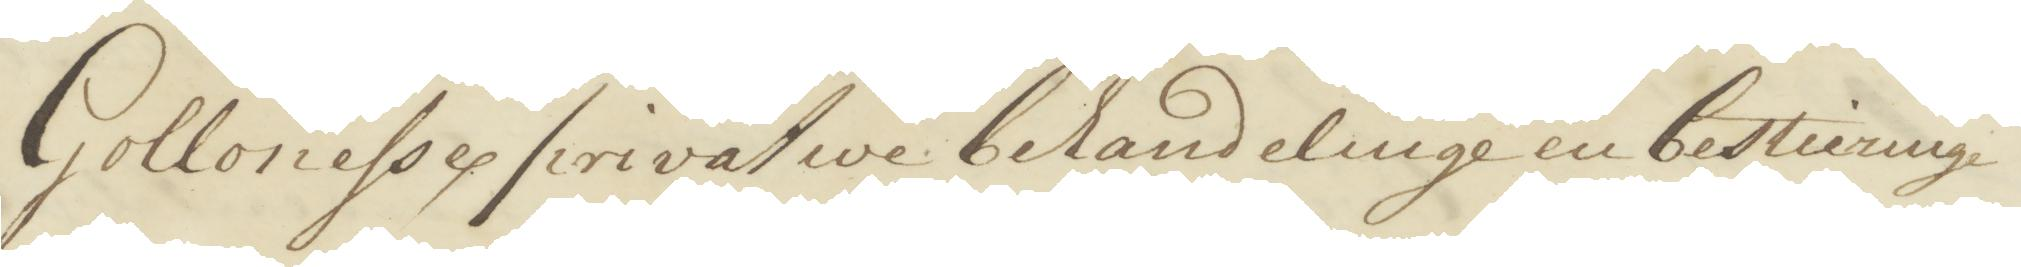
Gollonesse privative behandelinge en bestiering
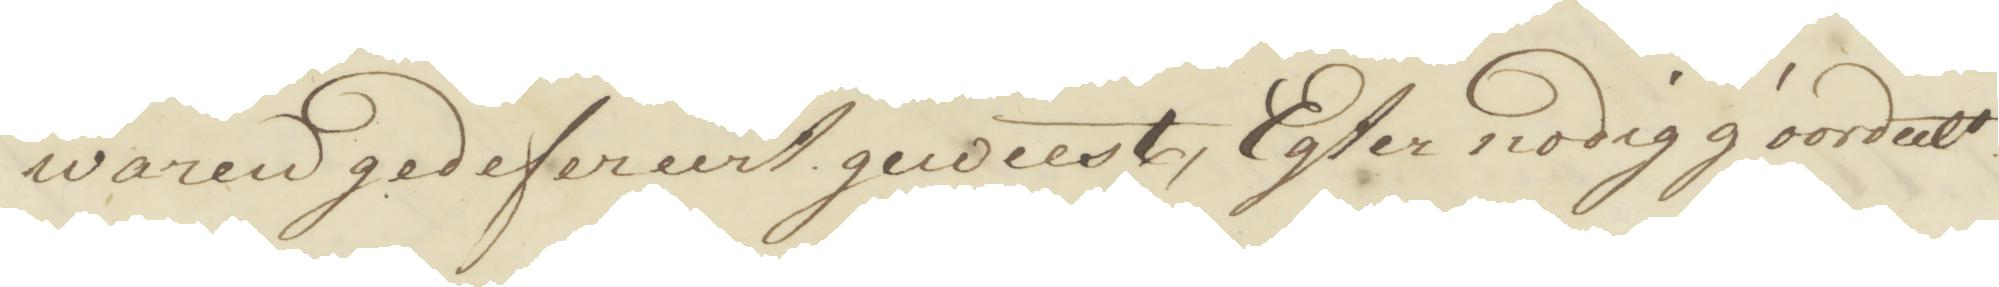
waren gedefereert geweest, Egter nodig g’oordeelt
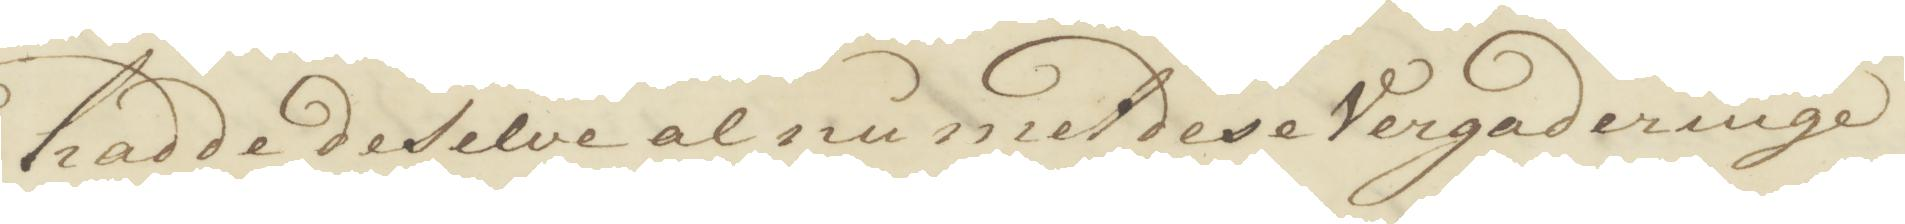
hadde deselve al nu met dese Vergaderinge
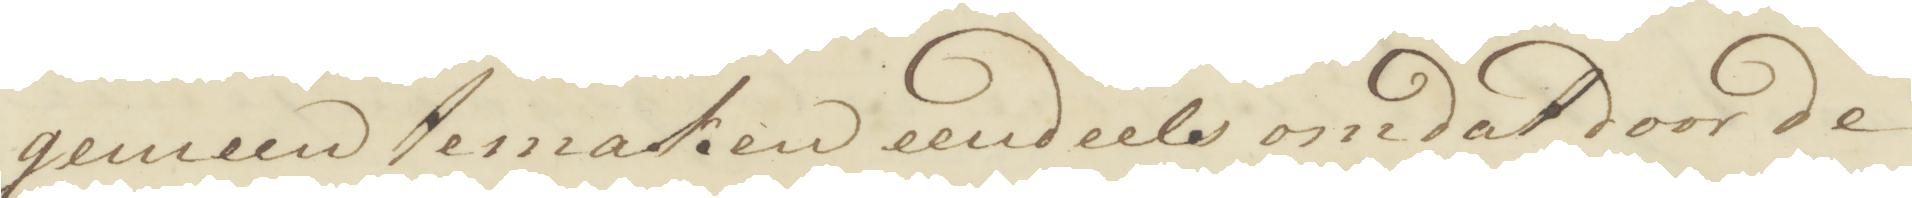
gemeen temaken eendeels om dat door de
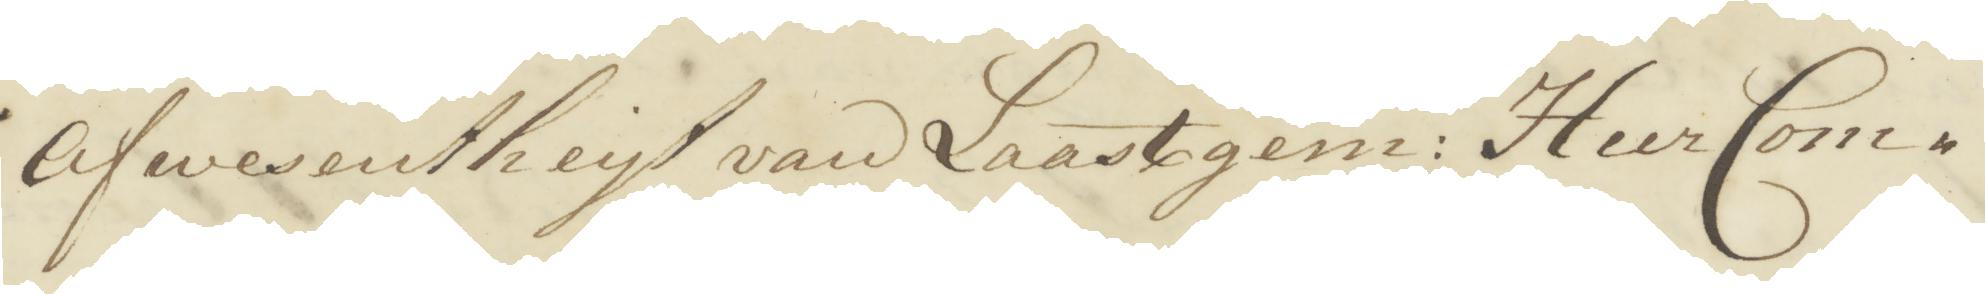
Afwesentheyt van Laast gem:e Heer Com„
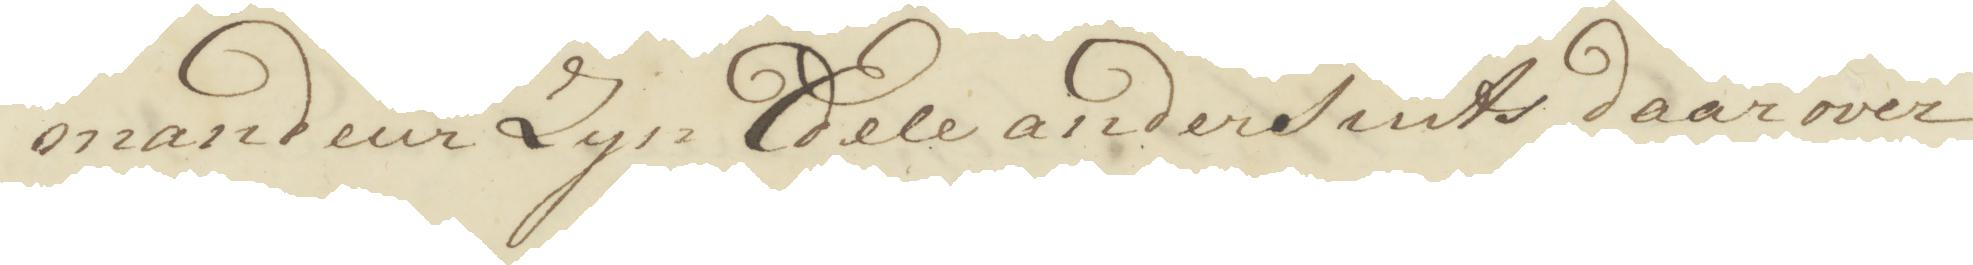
mandeur zyn Edele andersints daar over
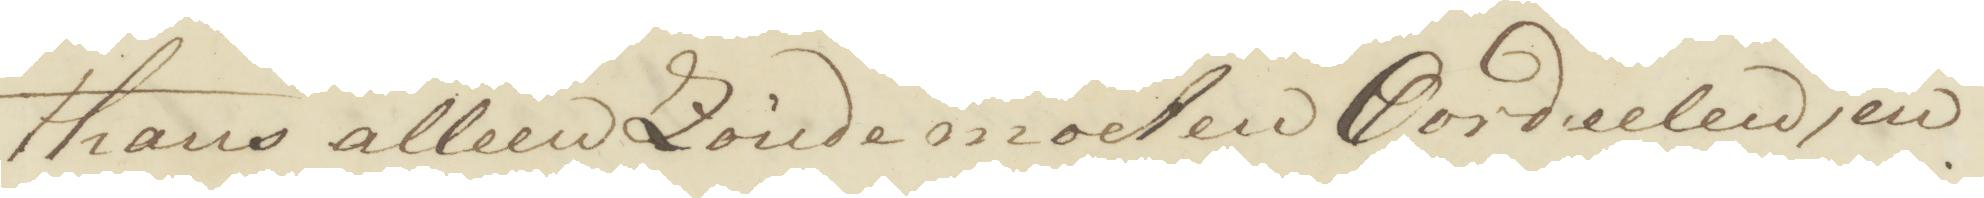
thans alleen zoude moeten Oordeelen, en
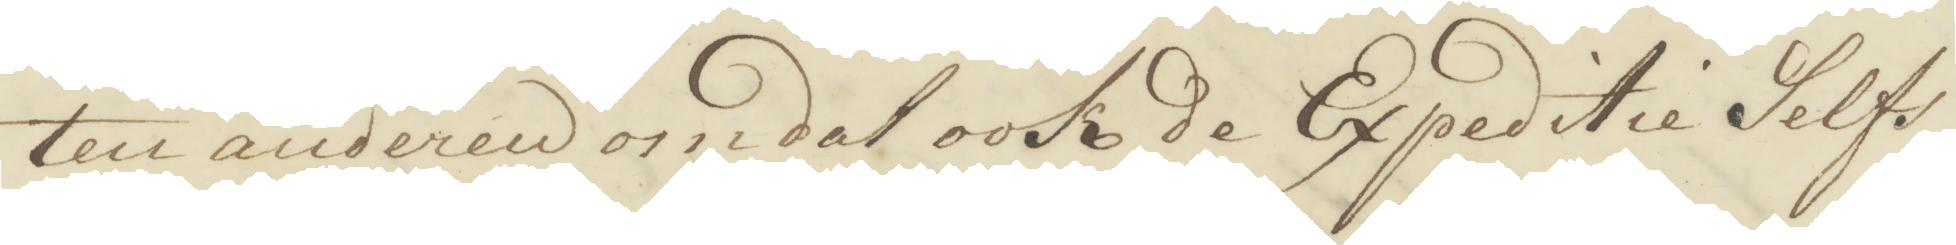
ten anderen om dat ook de Expeditie selfs
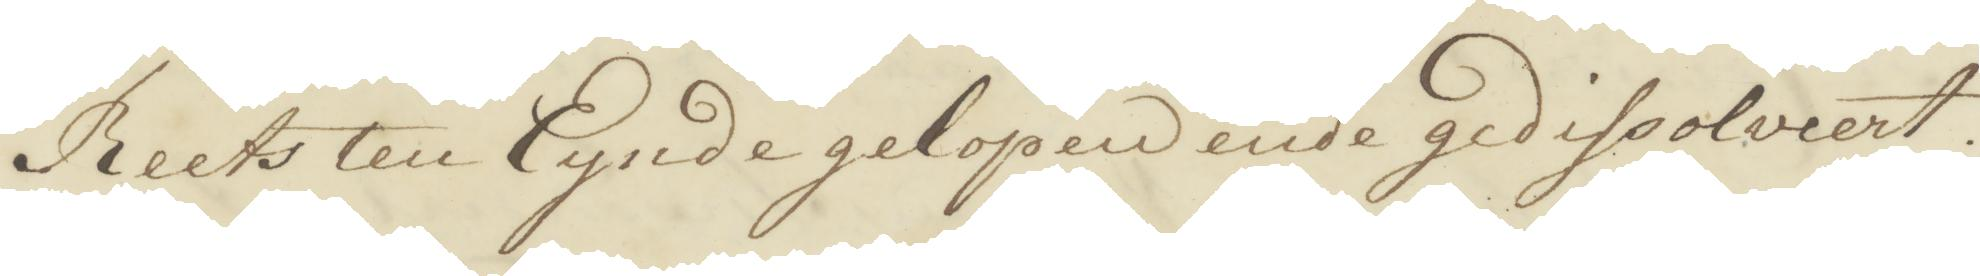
Reets ten Eynde gelopen ende gedissolveert.
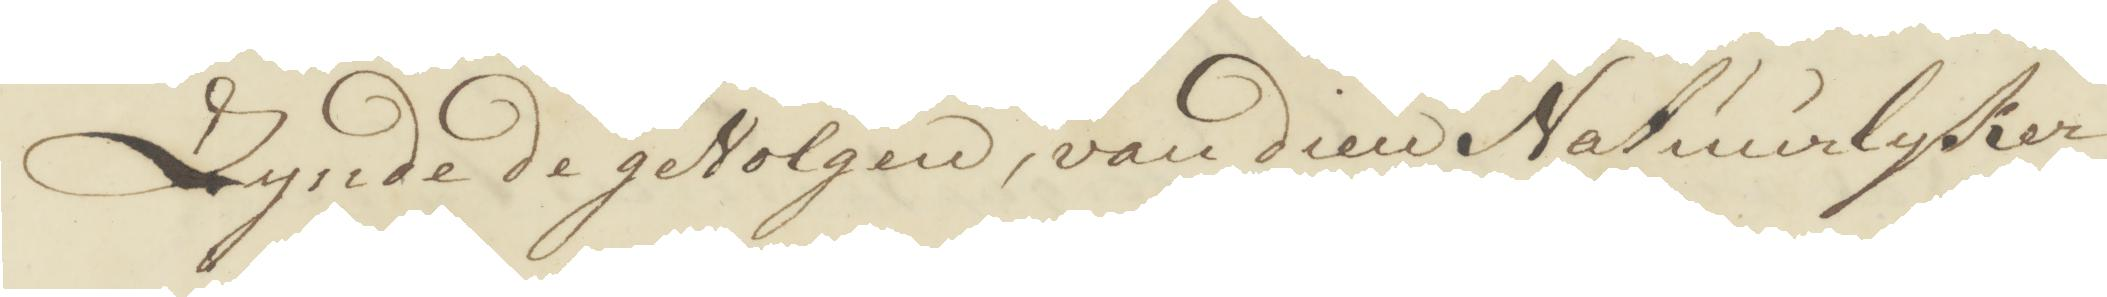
Zynde de gevolgen, van dien Natuurlyker
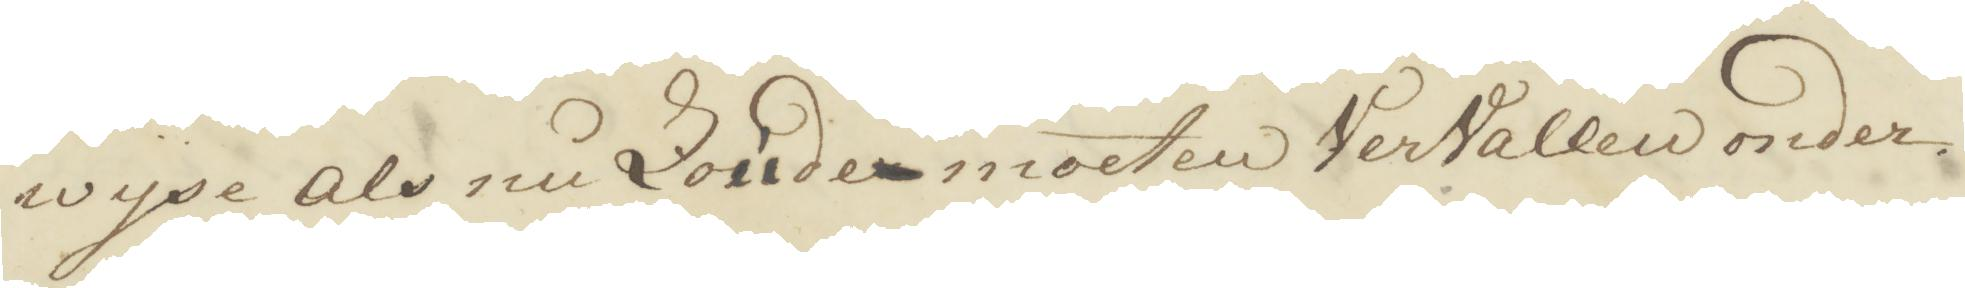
wijse als nu zoude moeten Vervallen onder
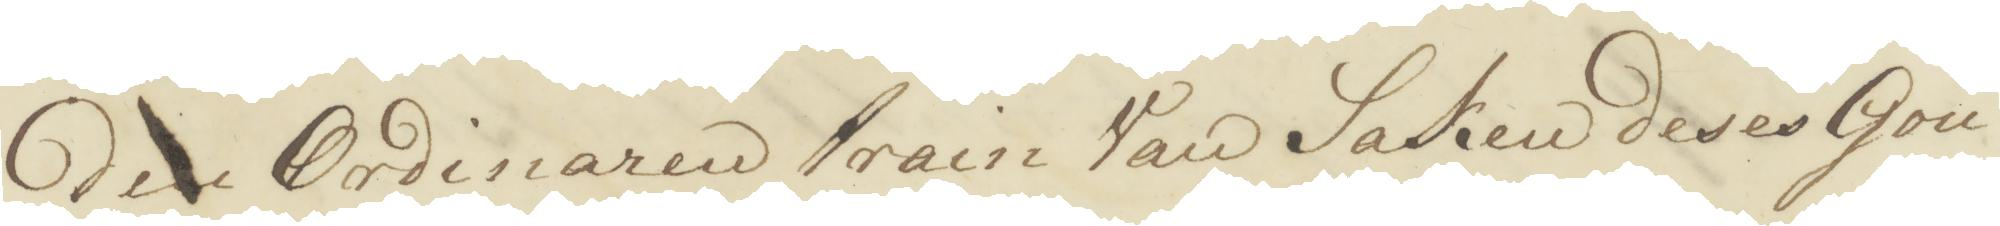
de Ordinaren train van saken deses Gou
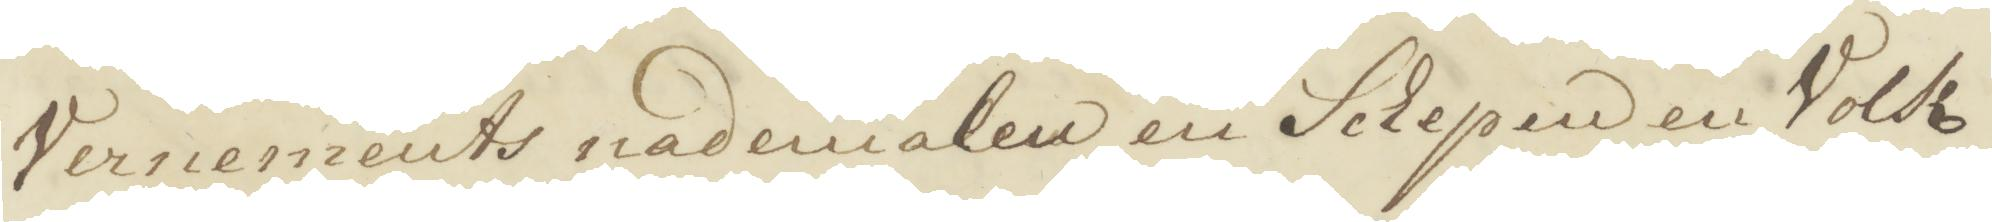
vernements nademalen en schepen en Volk
